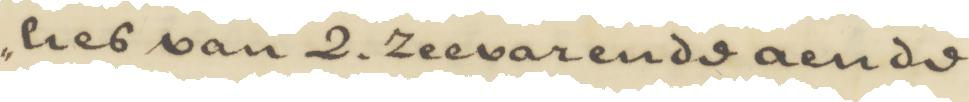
„lies van 2. zeevarende aen de
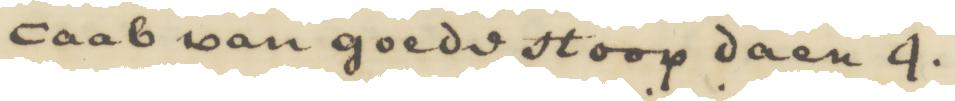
caab van goede Hoop daer 4.
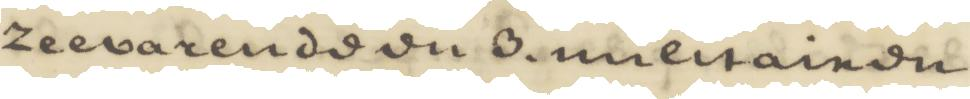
zeevarende en 3. militairen
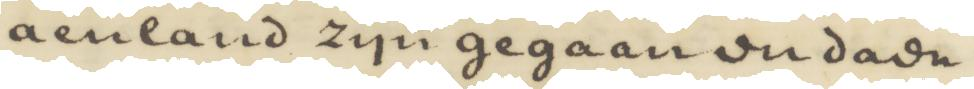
aen land zijn gegaan en daer
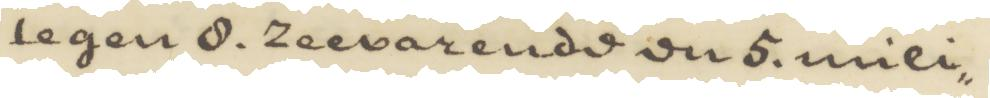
tegen 8. zeevarende en 5. mili„
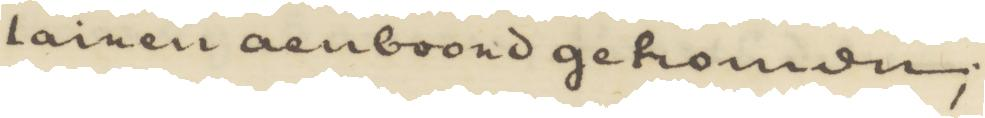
tairen aenboord gekomen;
